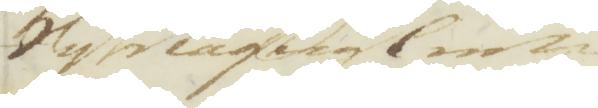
Vijftagtig Cents
